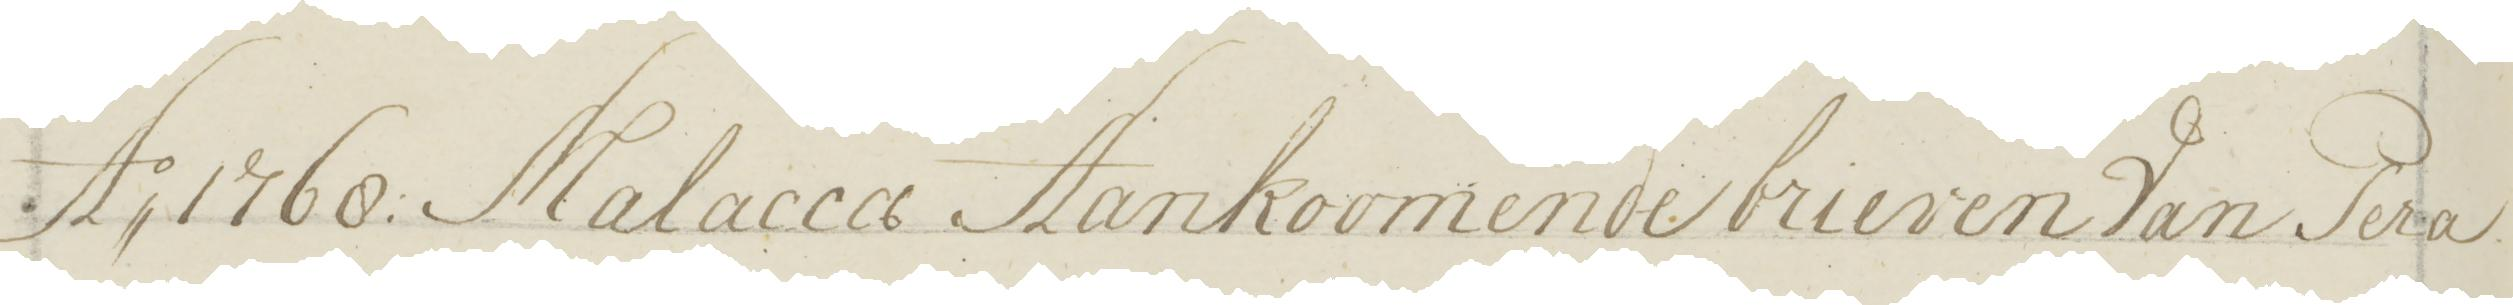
A„o 1768: Malacca Aankoomende brieven van Pera
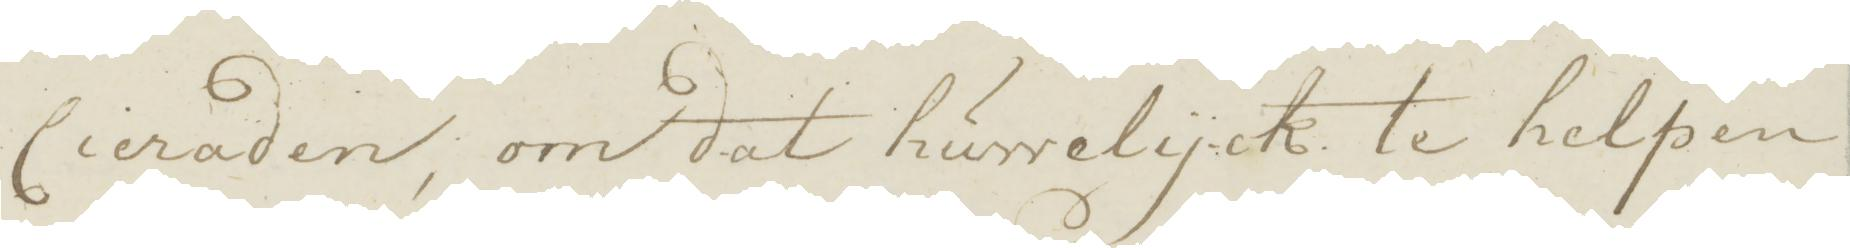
cieraden, om dat huwelijck te helpen
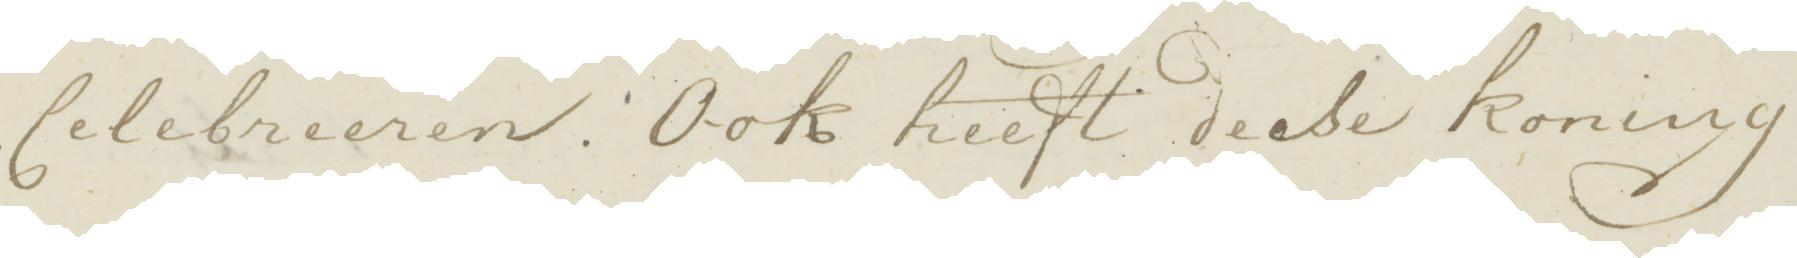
celebreeren. Ook heeft deese koning
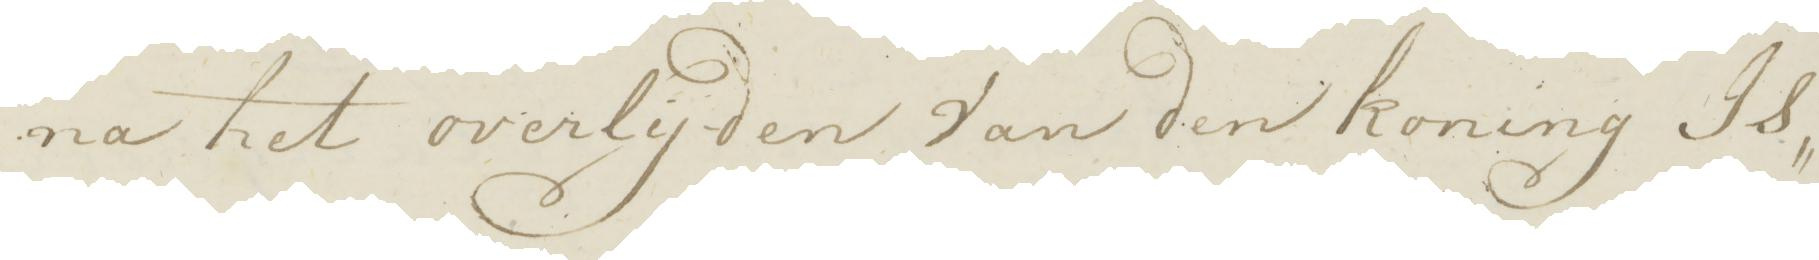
na het overlijden van den koning Is„
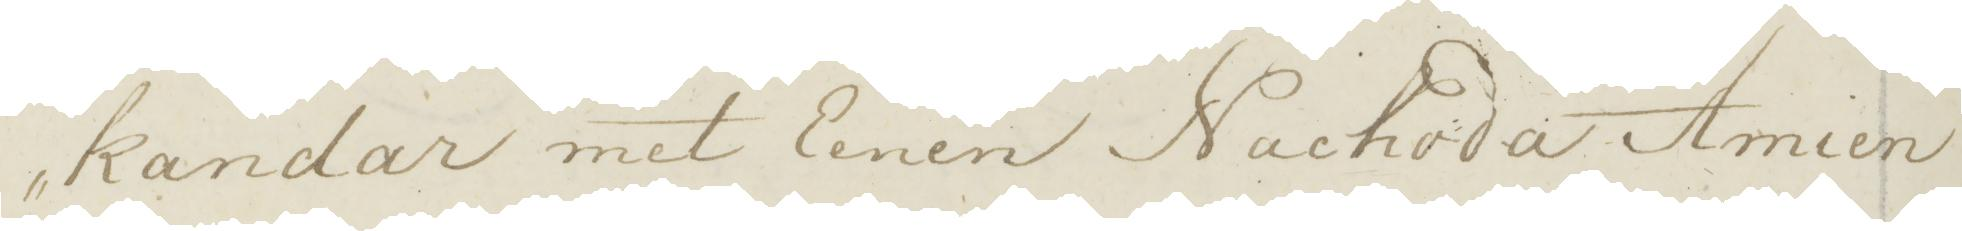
„kandar met Eenen Nachoda Amien
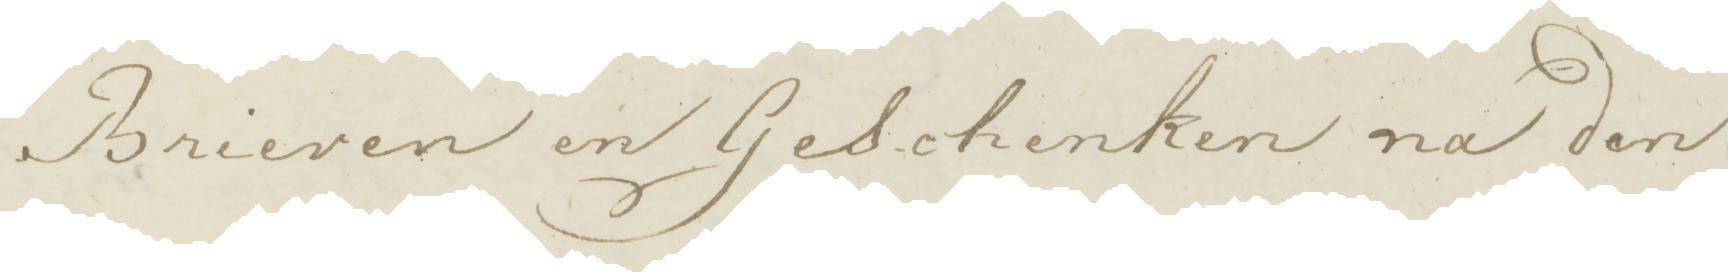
Brieven en Geschenken na den
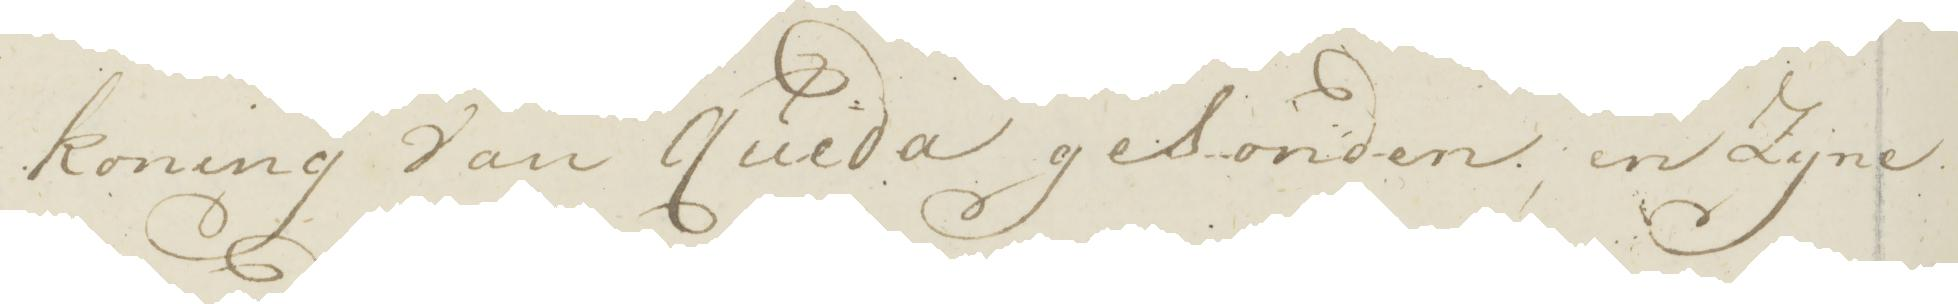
koning van Queda gesonden, en zyne
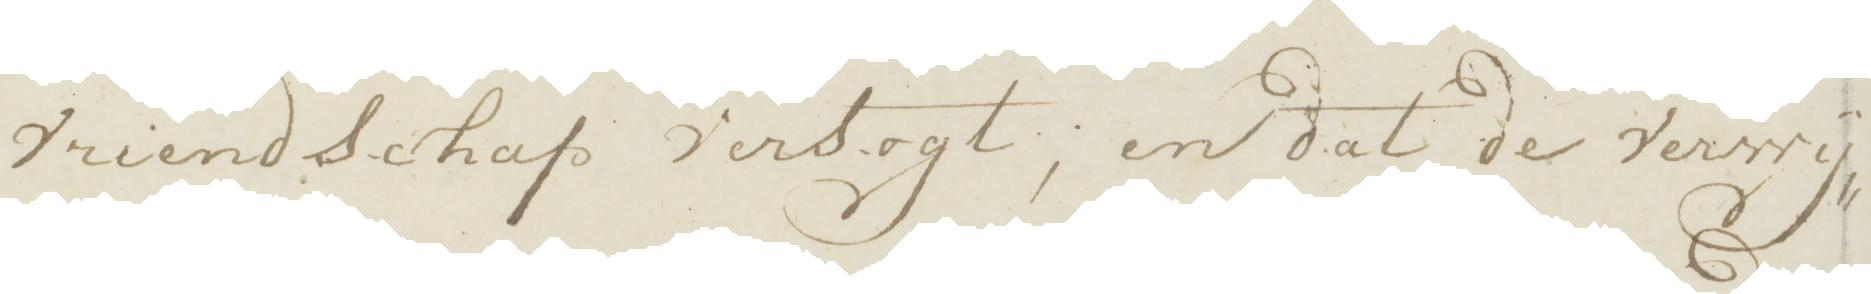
vriendschap versogt; en dat de verwij„
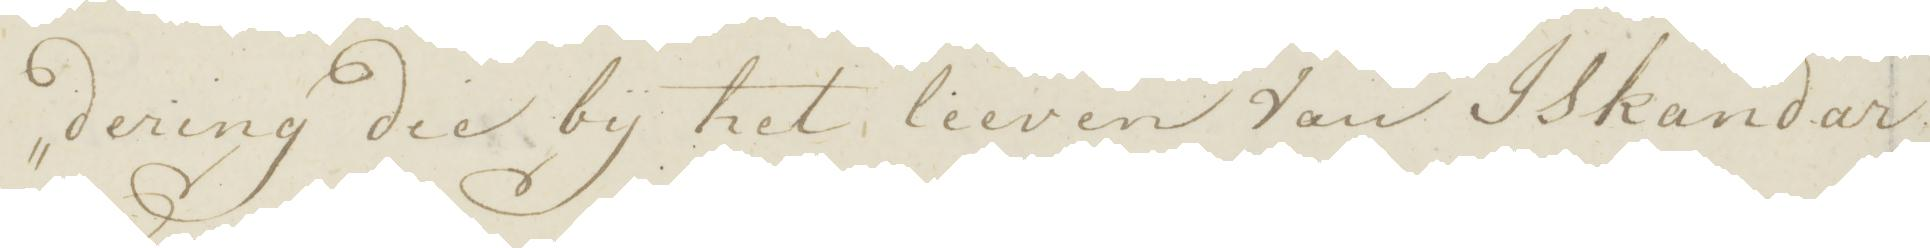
„dering die bij het leeven van Iskandar
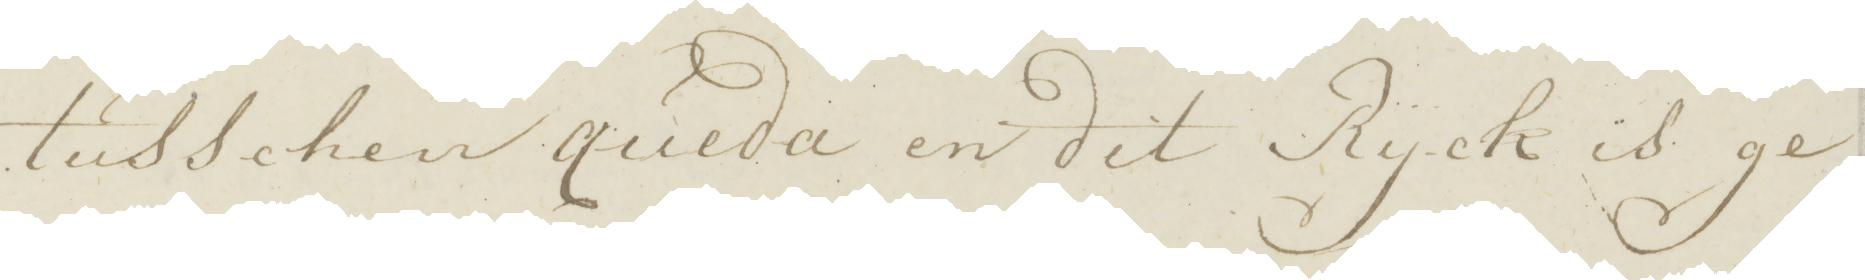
„tusschen queda, en dit Rijck is ge
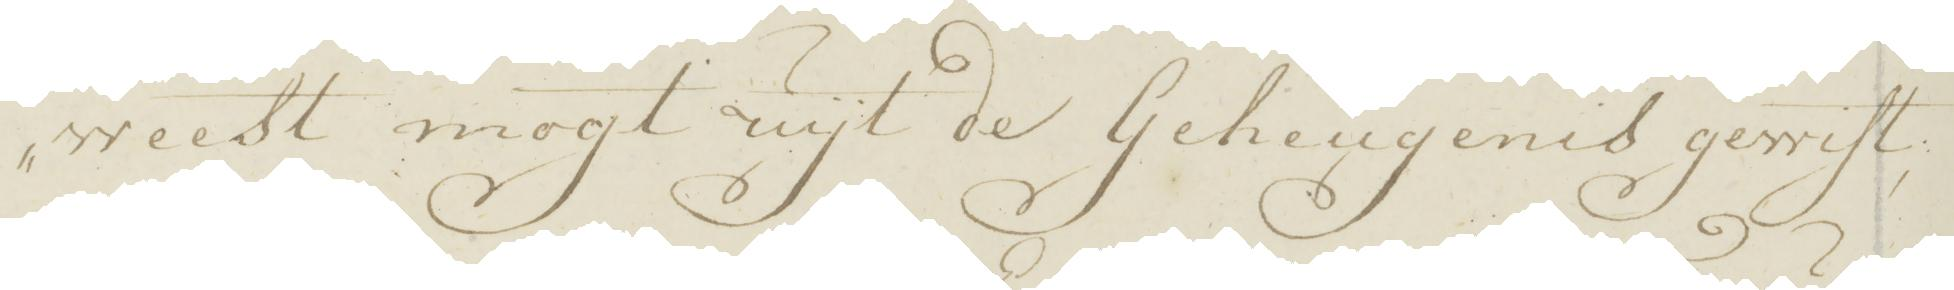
„weest mogt uijt de Geheugenis gewist;
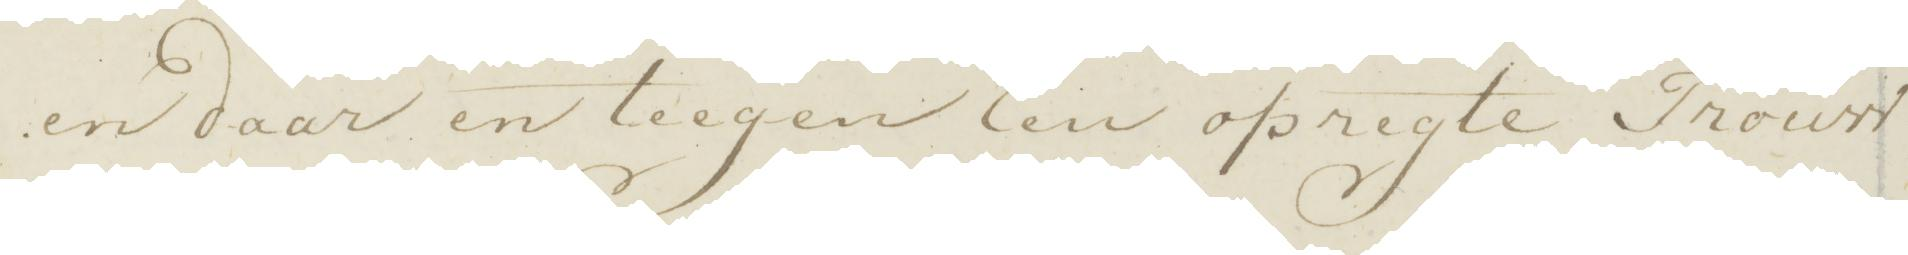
en daar en teegen Een opregte Trouw
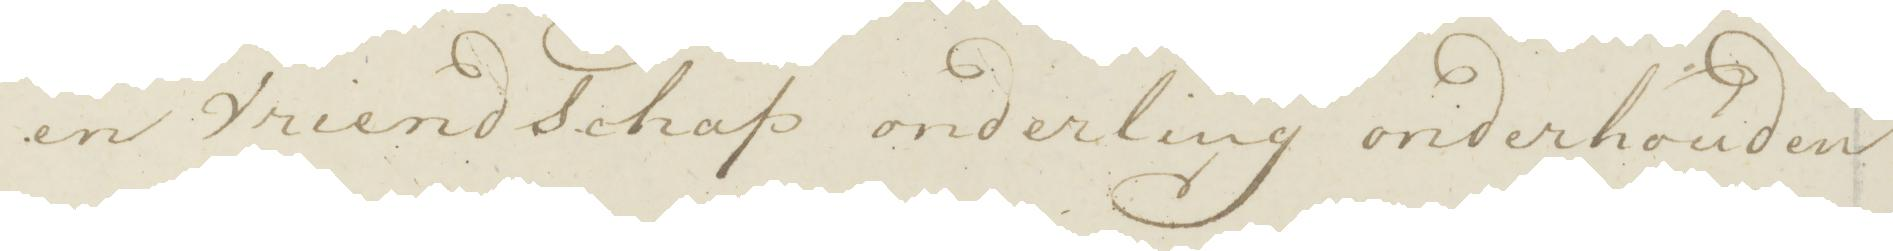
en vriendschap onderling onderhouden
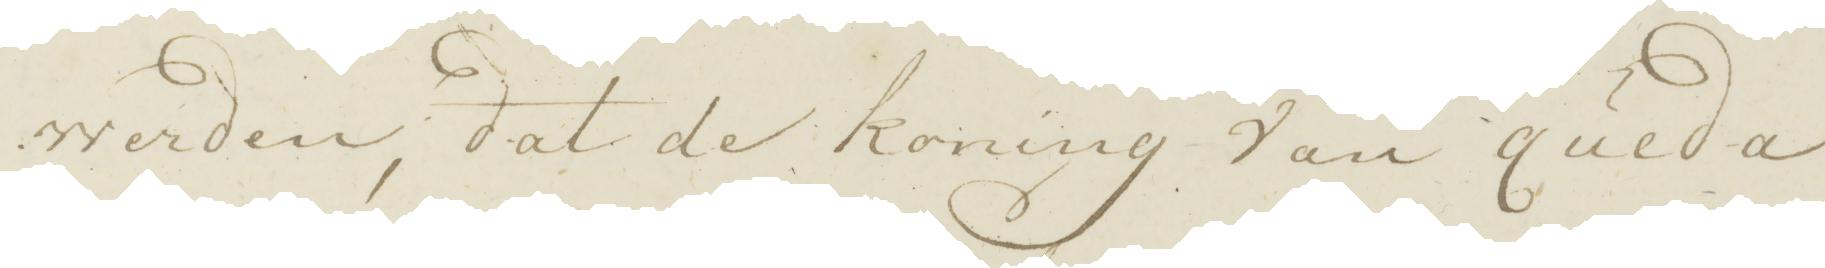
werden, dat de koning van queda
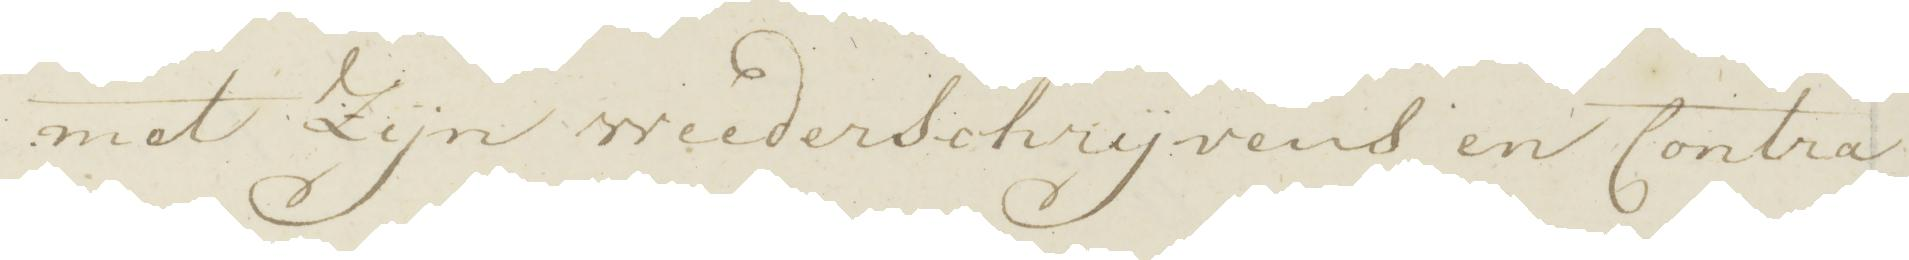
met zijn weederschrijvens en contra
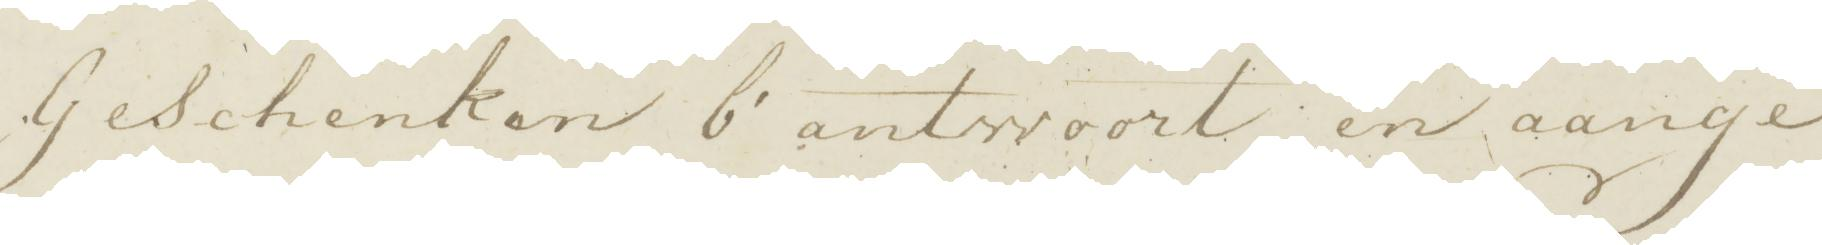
Geschenken b'antwoort en aange
